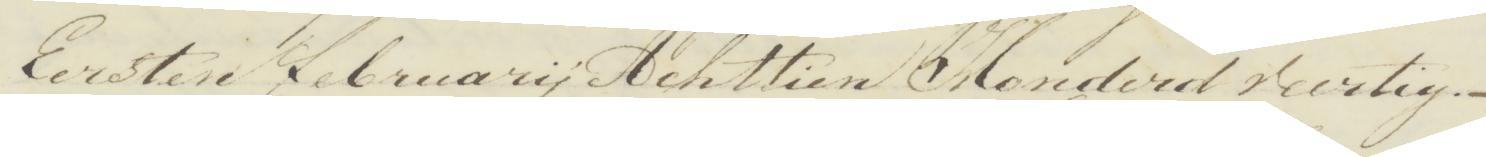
Eersten februarij Achttien Honderd Veertig.-
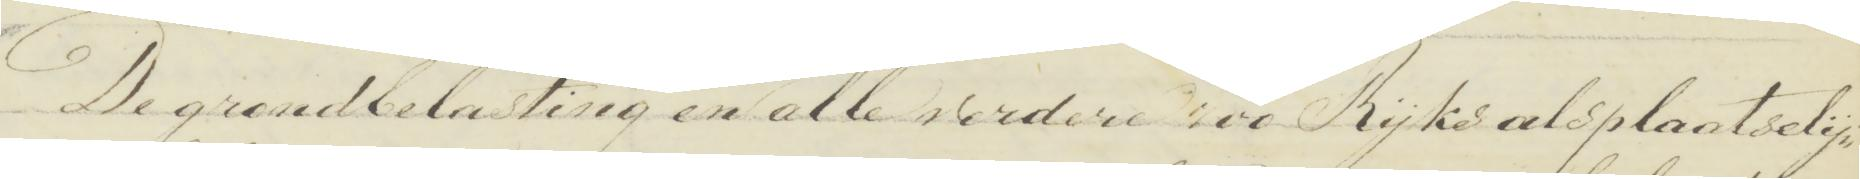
De grondbelasting en alle verdere zoo Rijks als plaatselij„
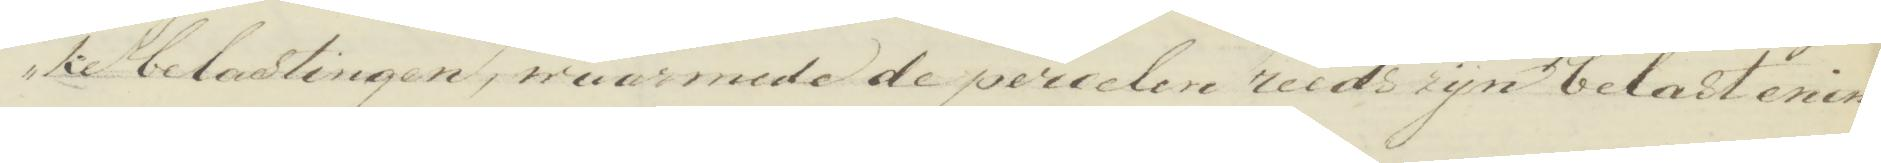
„ke belastingen, waarmede de percelen reeds zijn belast en in
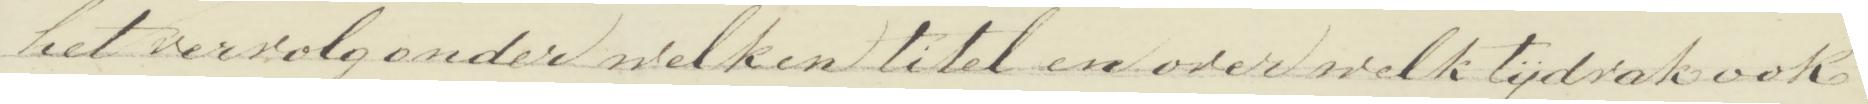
het vervolg onder welken titel en over welk tijdvak ook
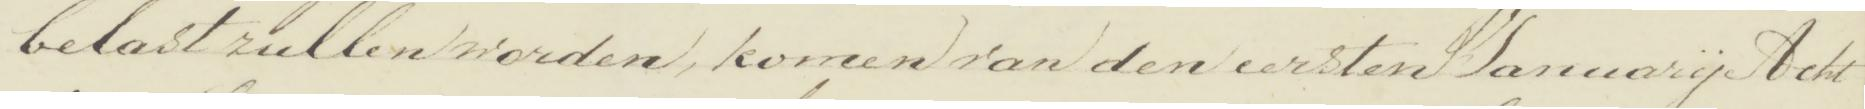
belast zullen worden, komen van den eersten Ianuarij Acht
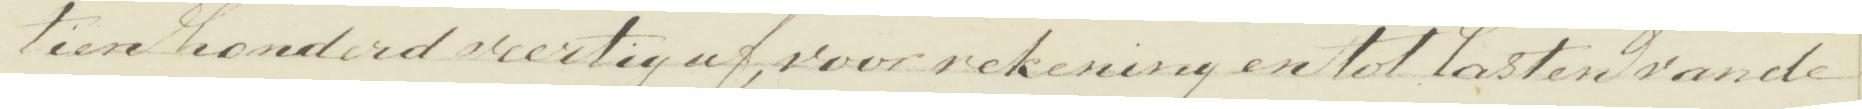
tien honderd veertig af, voor rekening en tot lasten van de
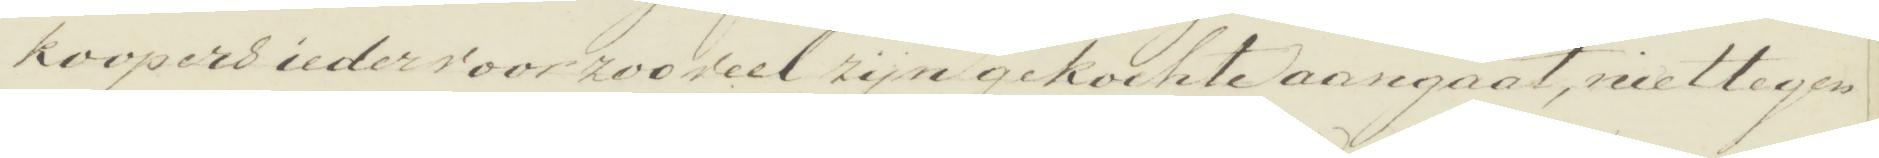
koopers ieder voor zoo veel zijn gekochte aangaat, niettegen
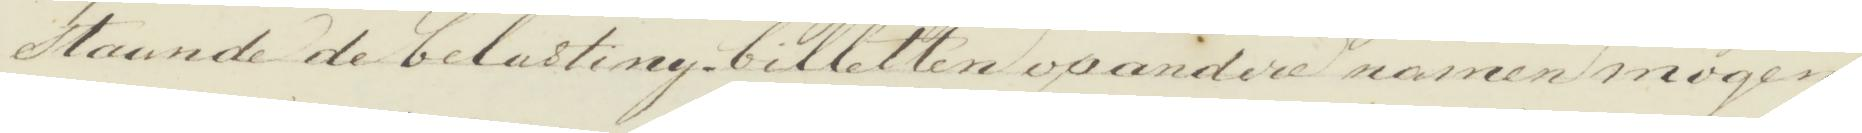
staande de belasting billetten op andere namen mogen
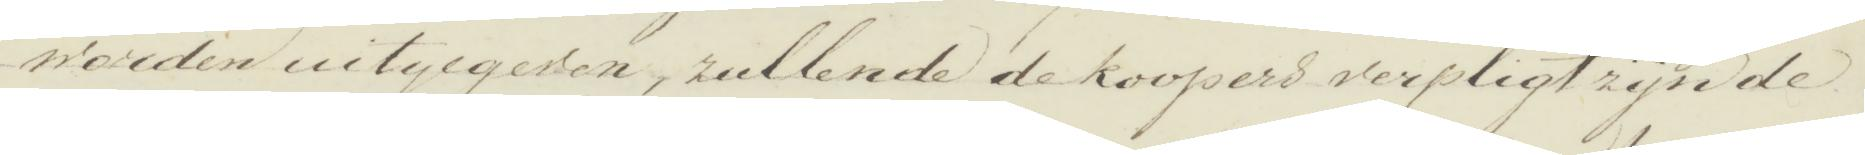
worden uitgegeven, zullende de koopers verpligt zijn de
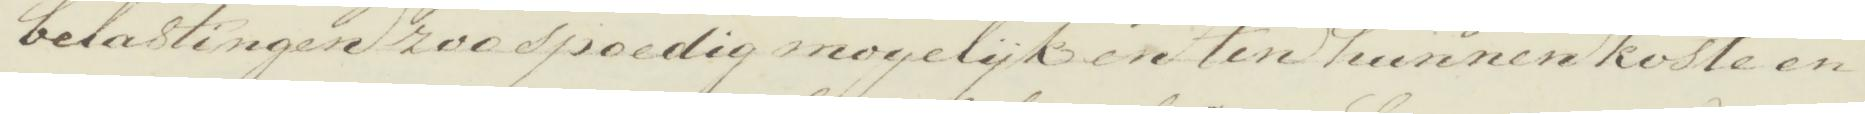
belastingen zoo spoedig mogelijk en ten hunnen koste en
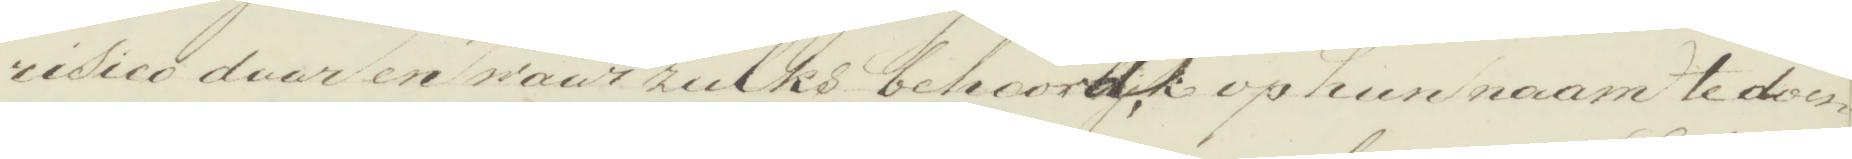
risico daar en waar zulks behoorljk op hun naam te doen
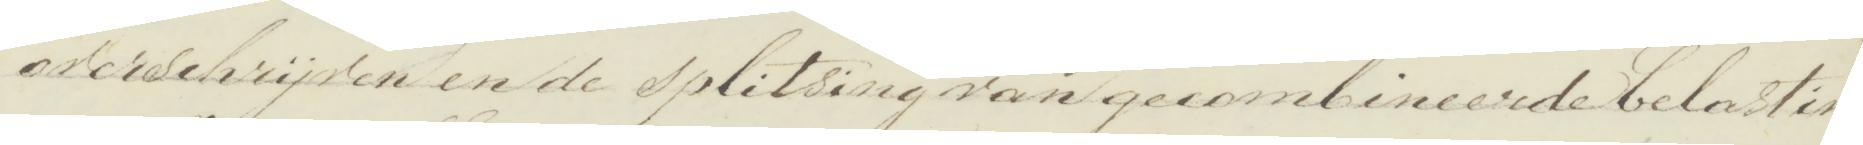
overschrijven en de splitsing van gecombineerde belastin
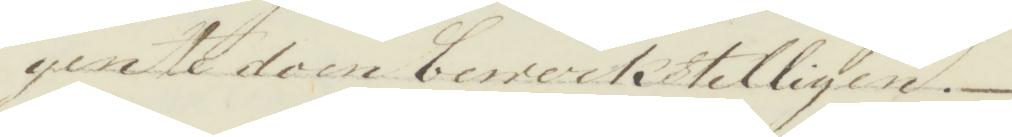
gen te doen bewerkstelligen.—
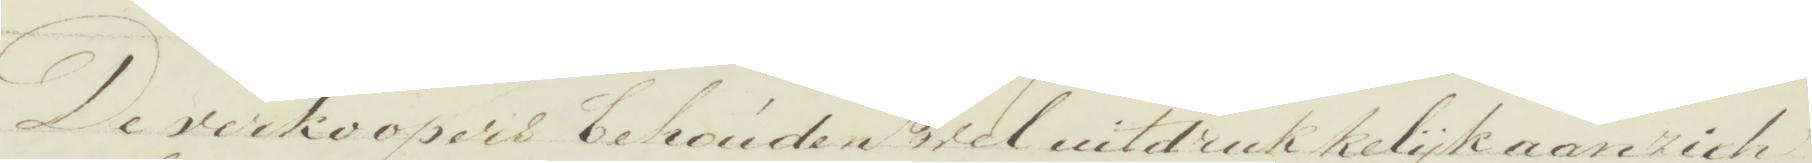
De verkoopers behouden wel uitdrukkelijk aan zich
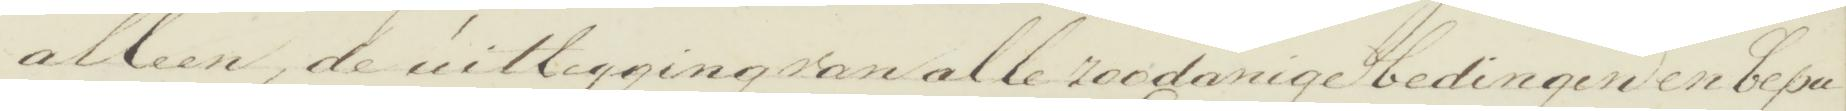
alleen, de uitlegging van alle zoodanige bedingen en bepa
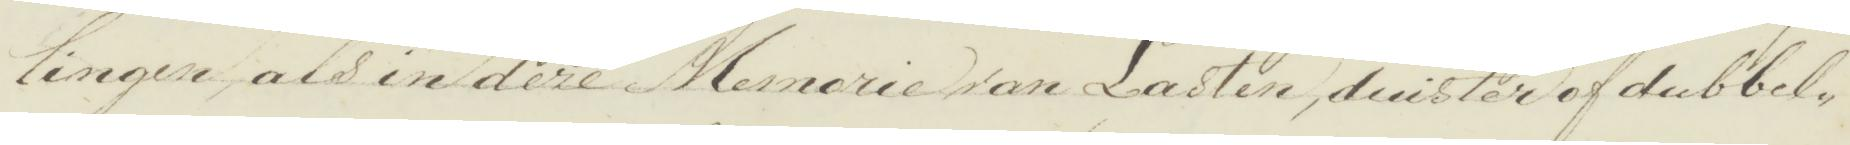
lingen, als in deze Memorie van Lasten, duister of dubbel„
